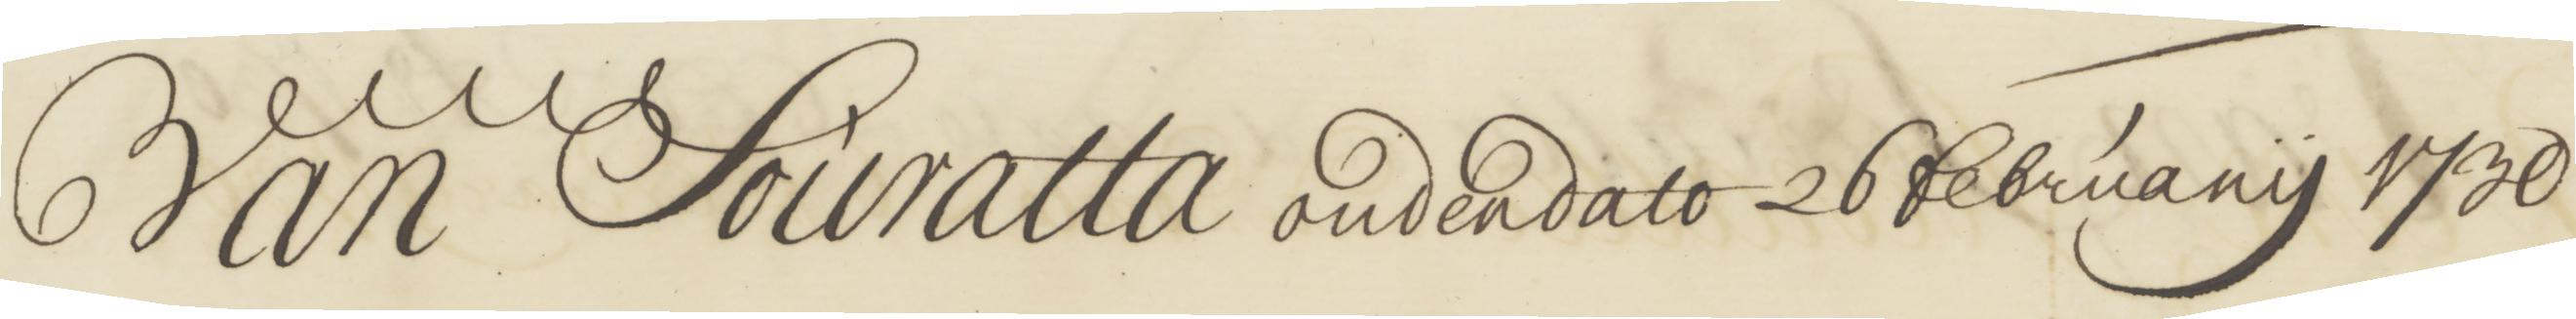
Van Souratta onderdato 26 februarij 1730
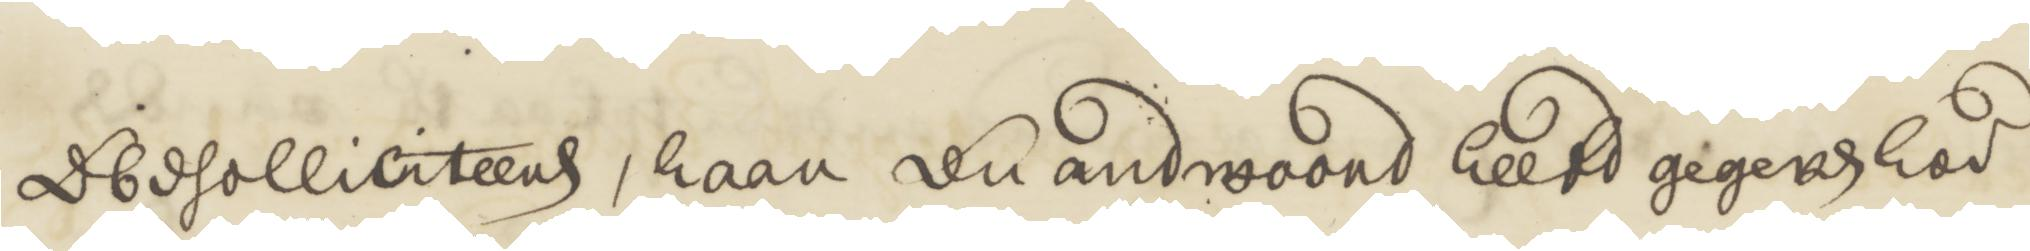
tebesolliciteeren, haar ten andwoord heefd gegeven hoe
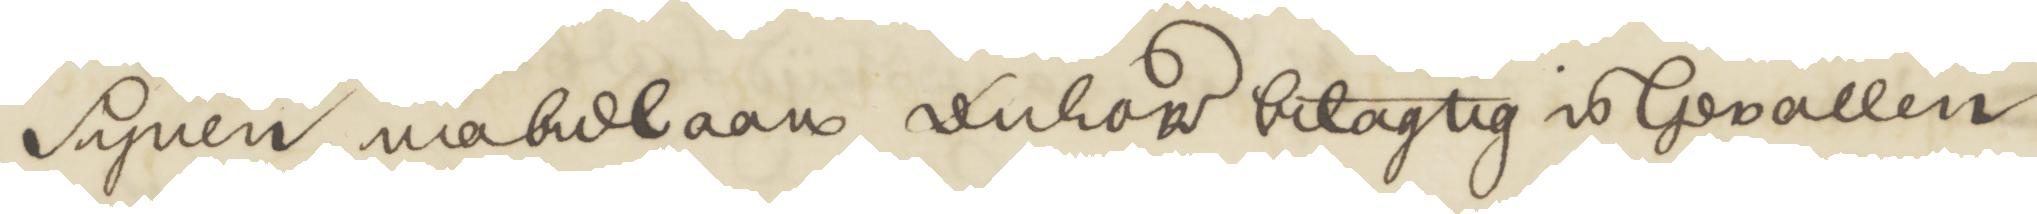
synen makelaar tenhove klagtig is Gevallen
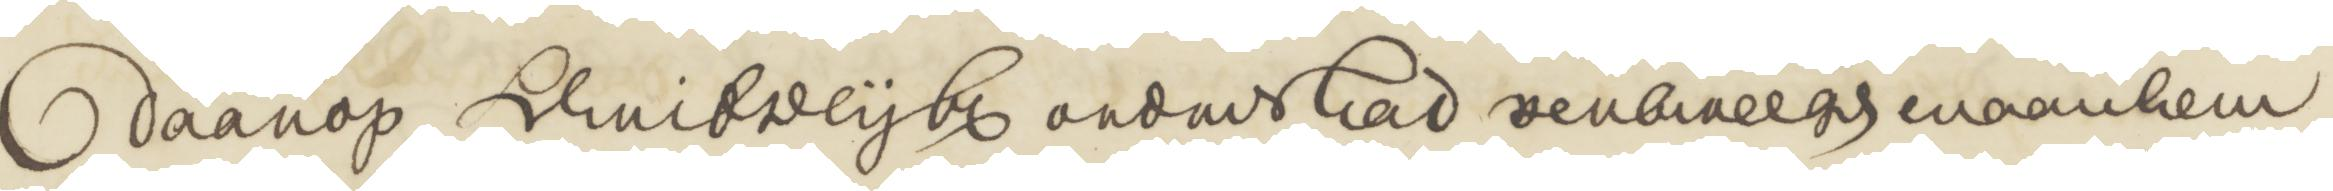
daarop schriftelijk ordreshad verkreegen enaanhem
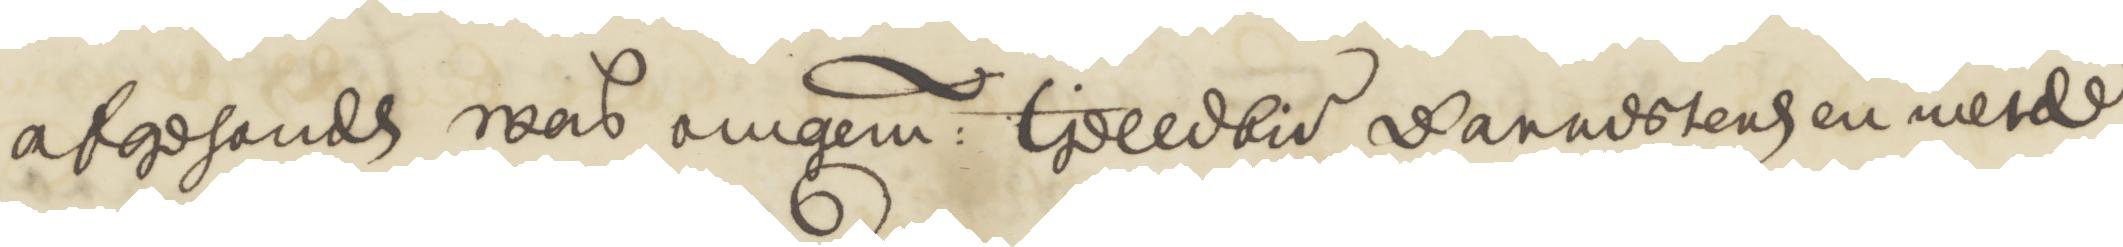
afgesonden was omgem: tjellebie te arresteren en metde
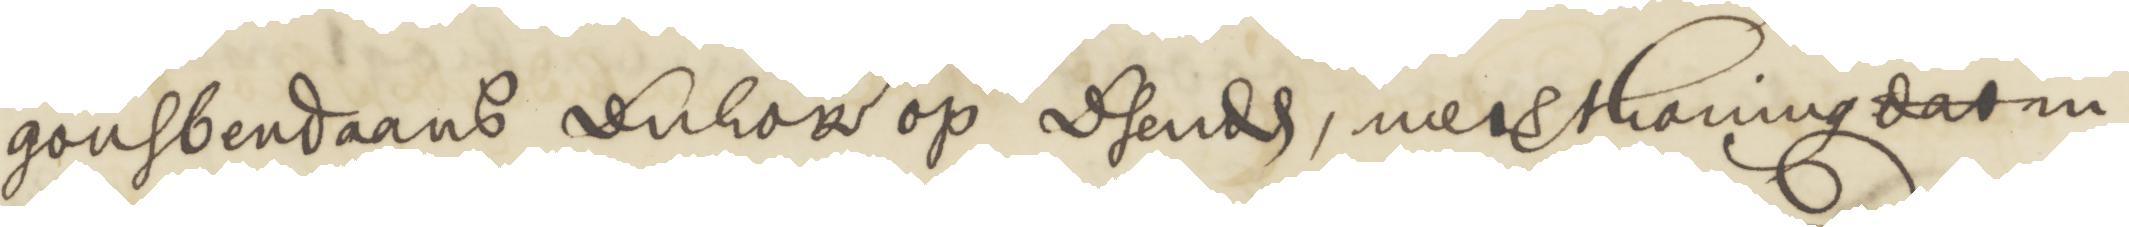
gousberdaars tenhove op tesenden, metverthoning dat in
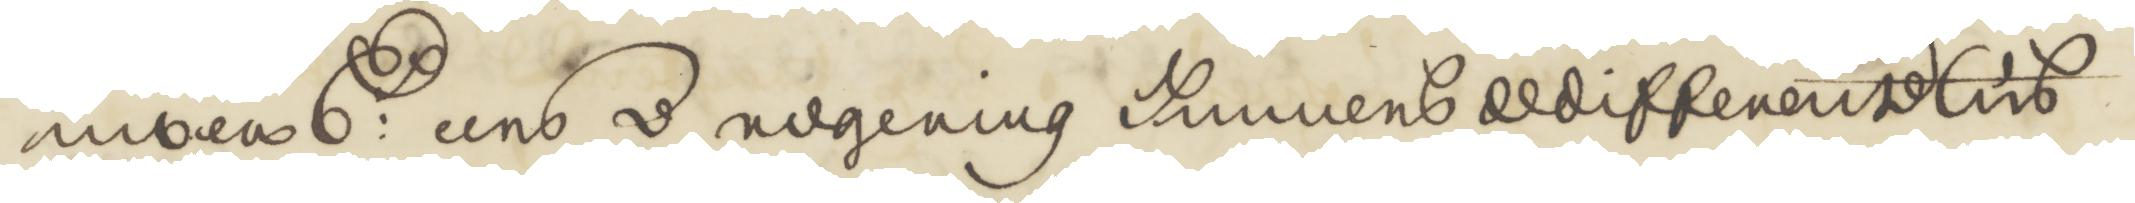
uwer E:s eerste regering Immers dedifferente tus
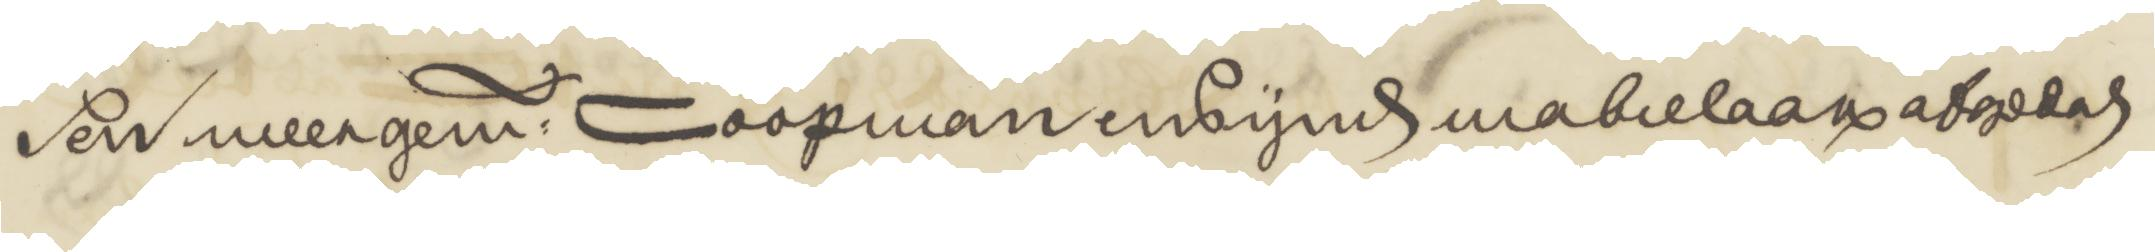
sen meergem: Coopman en sijnen makelaar afgedaen
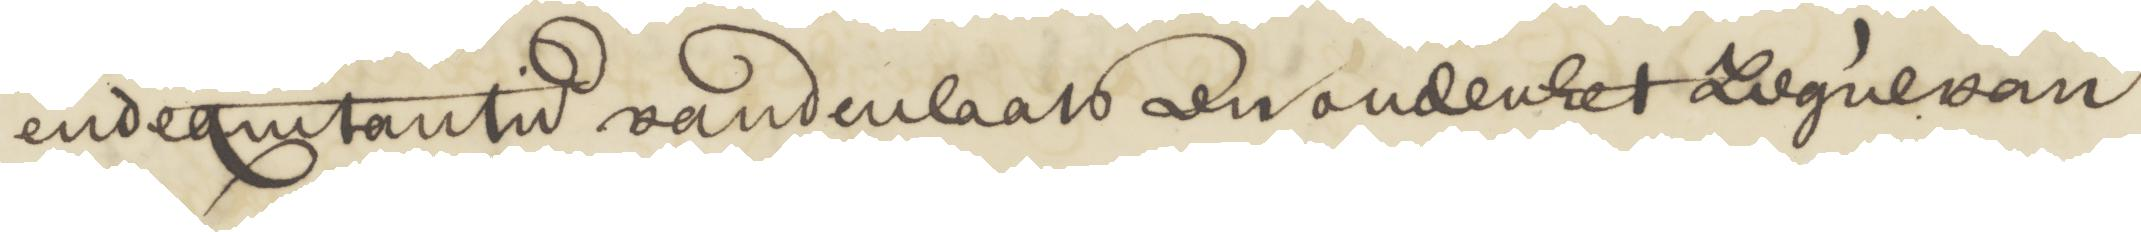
endequitantie vandenlaatsten onderhet zegulvan
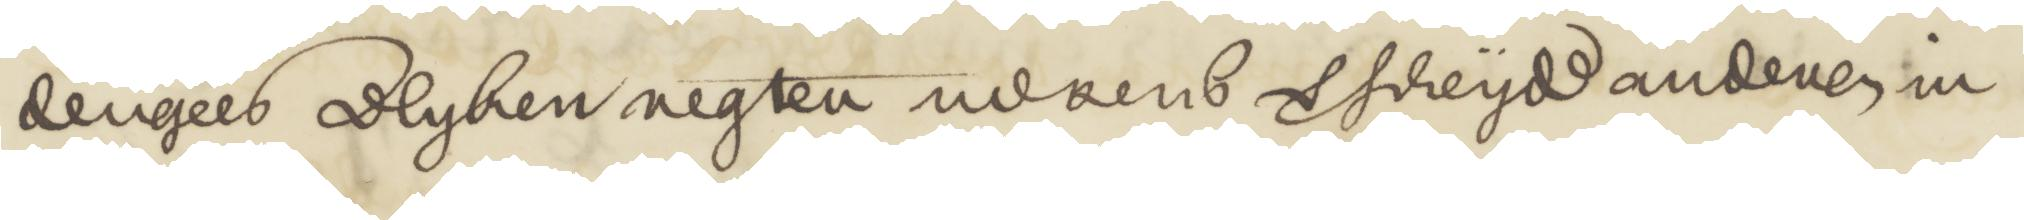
dengeestelyken regter nevens verscheijde anderen in
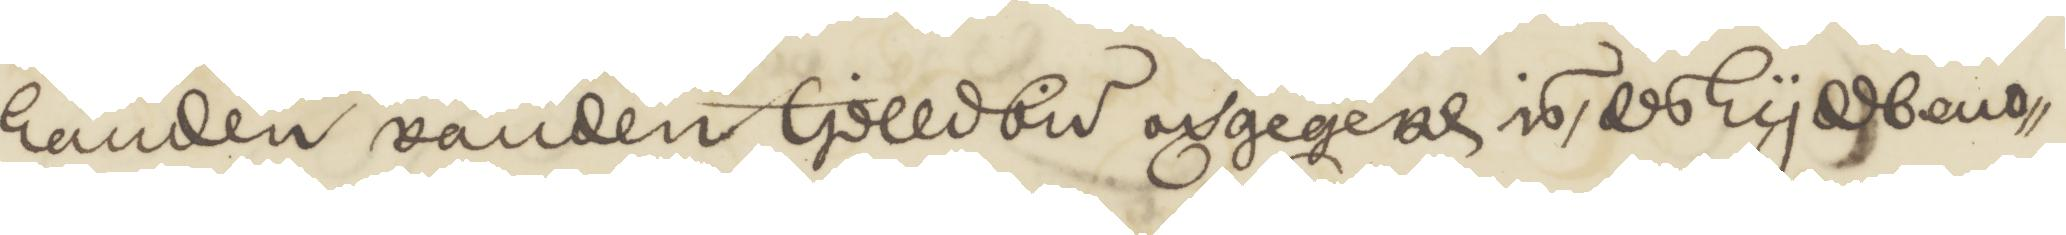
handen vanden tjellebie overgegeven is, deshij de beno„
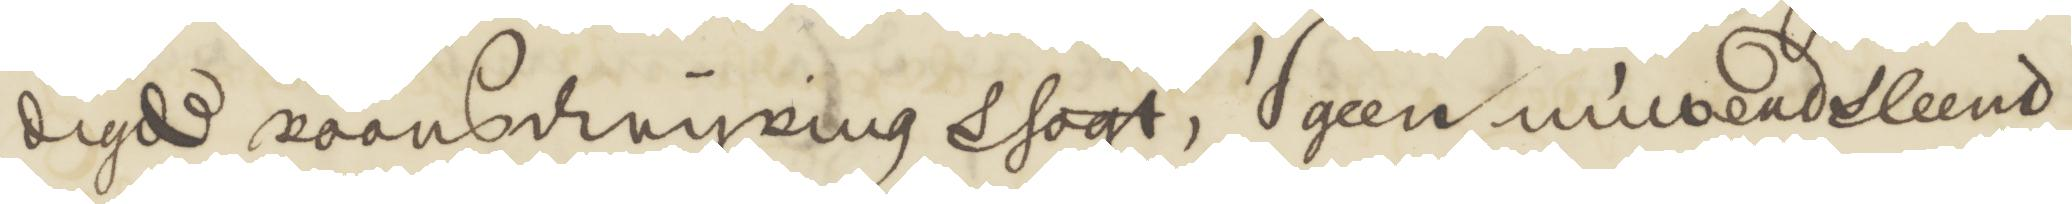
digde voorschrijving versogt, 't geen nuwerd verleend
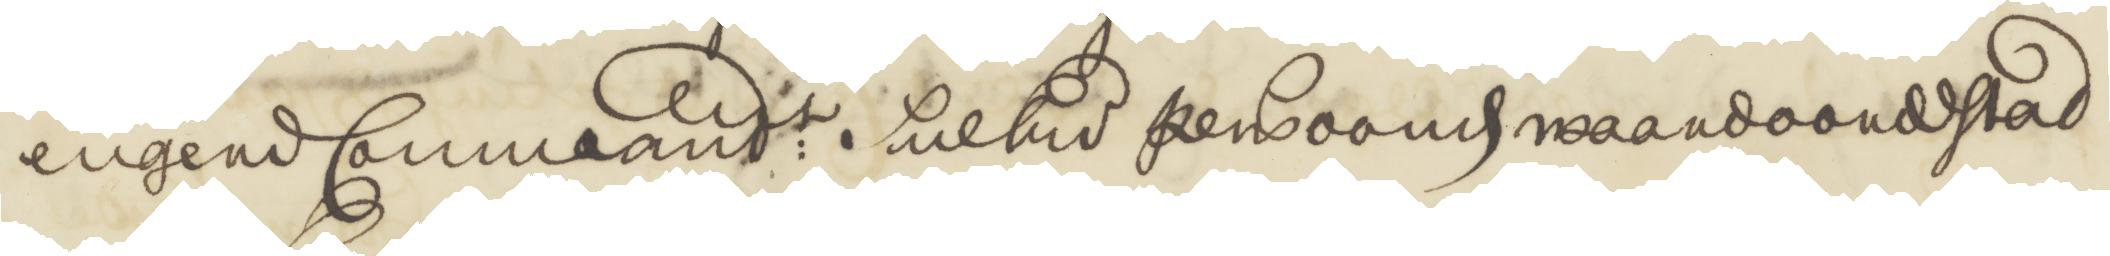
engere Command:t sulke persoonen waardoordestad
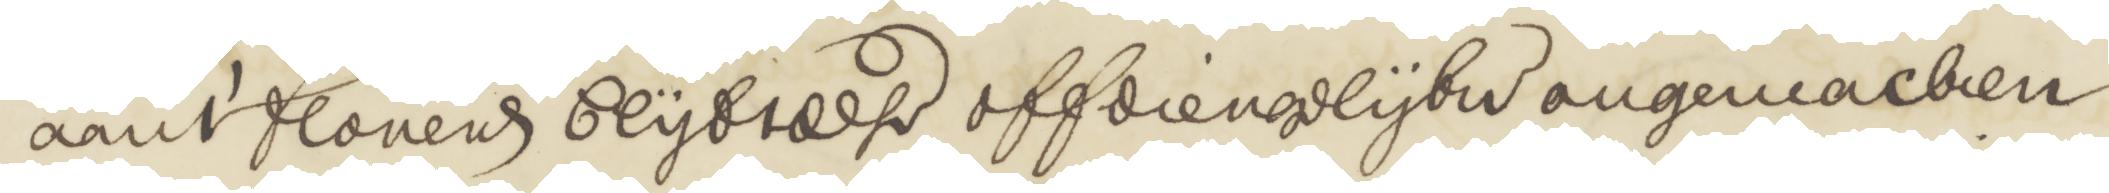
aant' floreren blijftdese off diergelijke ongemacken
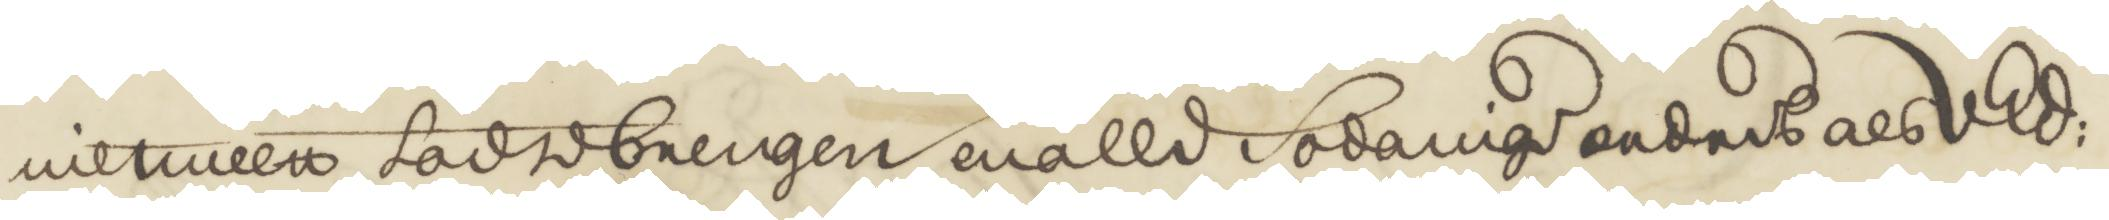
nietmeer toetebrengen enalle sodanige ordres als VEd:
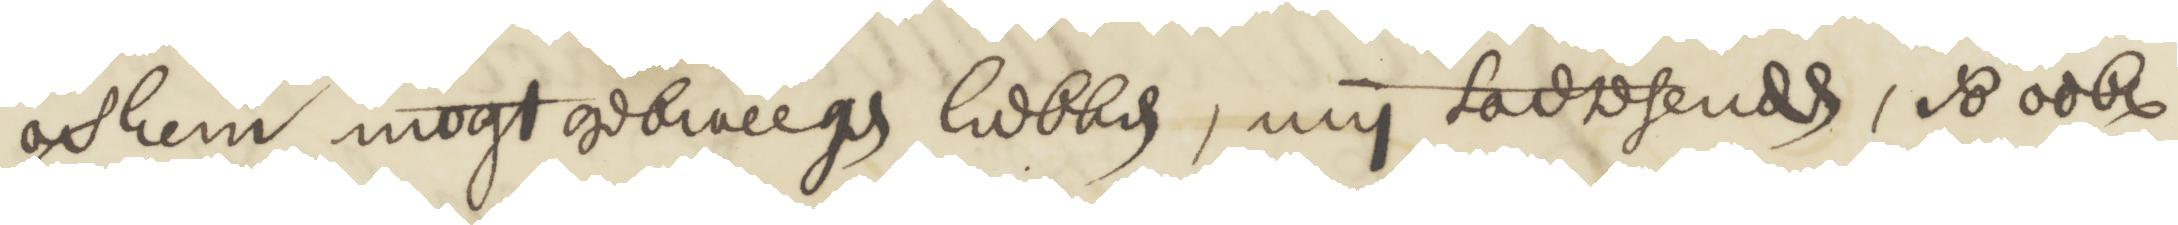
over hem mogt gekreegen hebben, mij toetesenden, so ook
